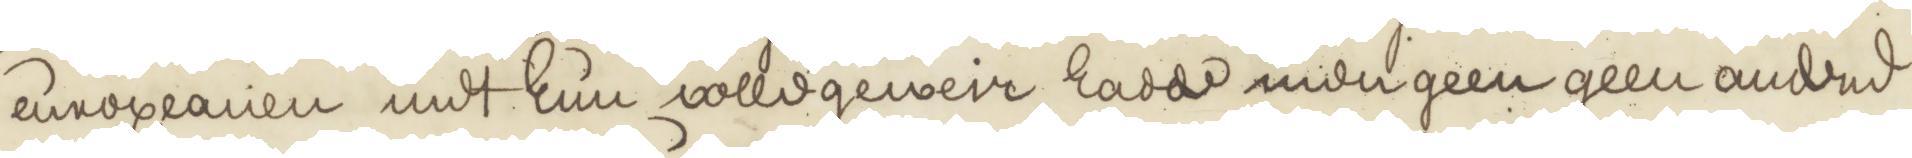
europeanen met hun volle geweir hadde men geen geen andere
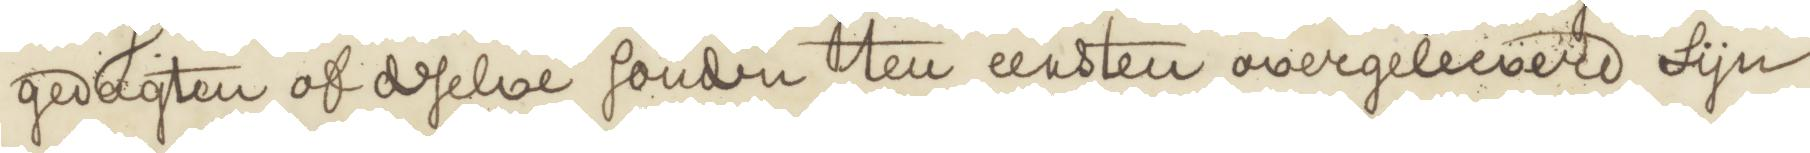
gedagten of deselve souden ten eersten overgeleeverd sijn
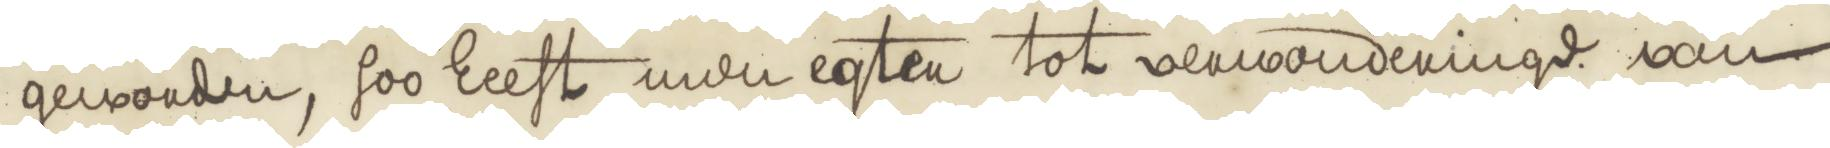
geworden, soo heeft men egter tot verwonderinge van
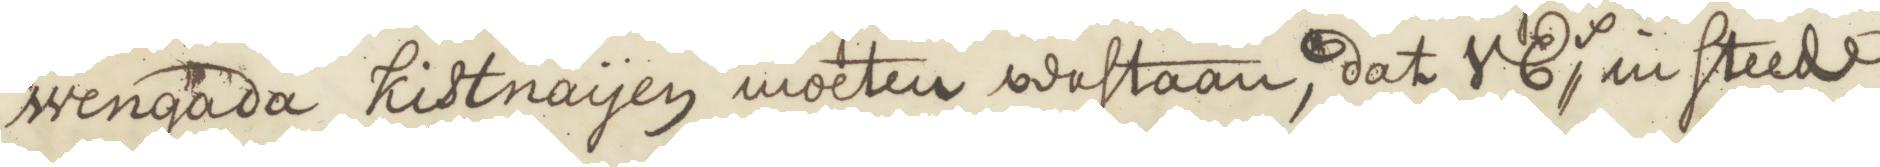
wengada kistnaijen moeten verstaan, dat VE„s in steede
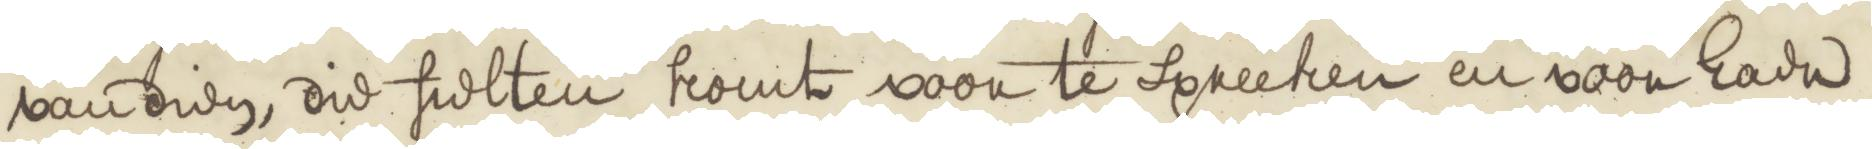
van dien, die fielten komt voor te spreeken en voor haer
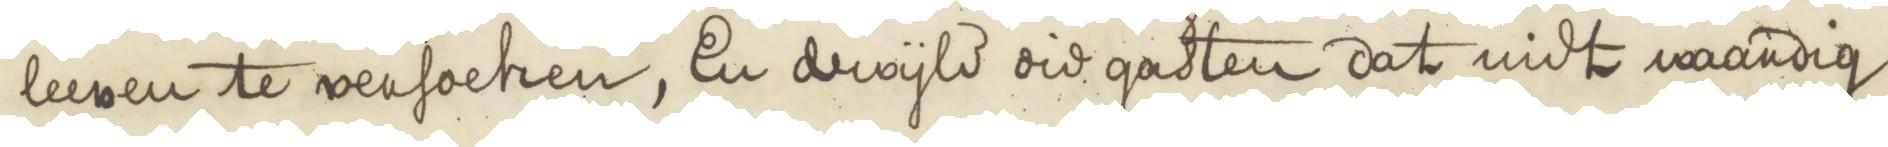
leeven te versoeken, En dewijle die gasten dat niet waardig
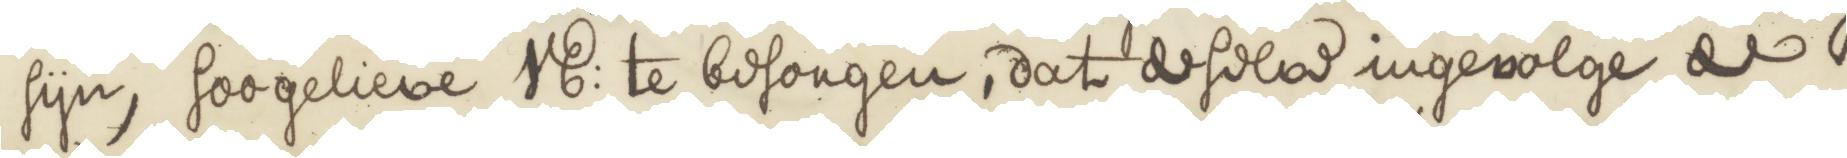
sijn, soo gelieve VE: te besorgen, dat deselve ingevolge de
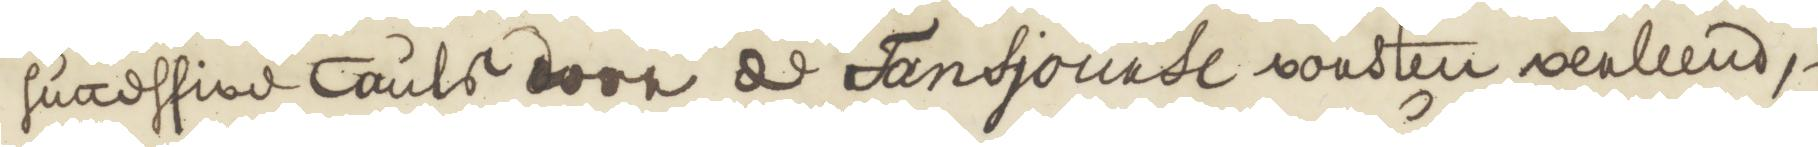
sucessive Cauls door de Tansjourse vorsten verleend,
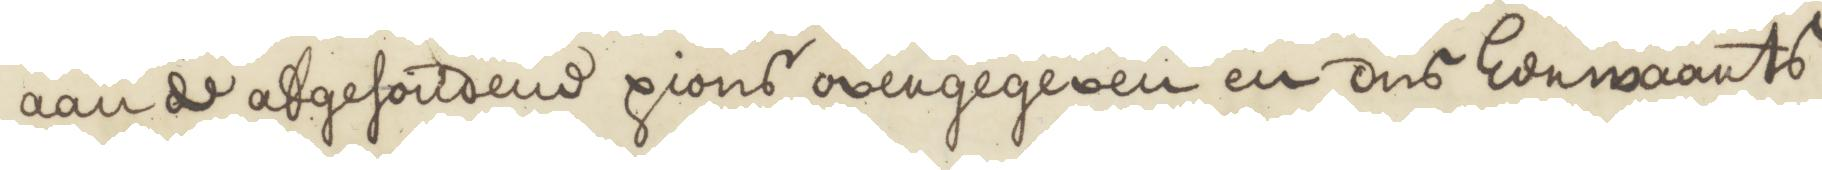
aan de afgesondene pions overgegeven en dus herwaarts
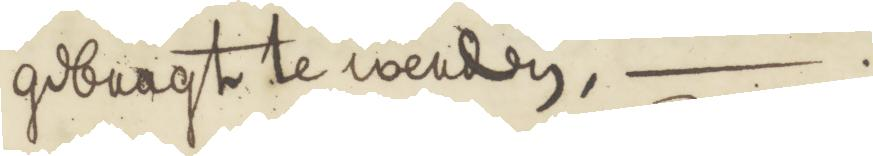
gebragt te werden,—
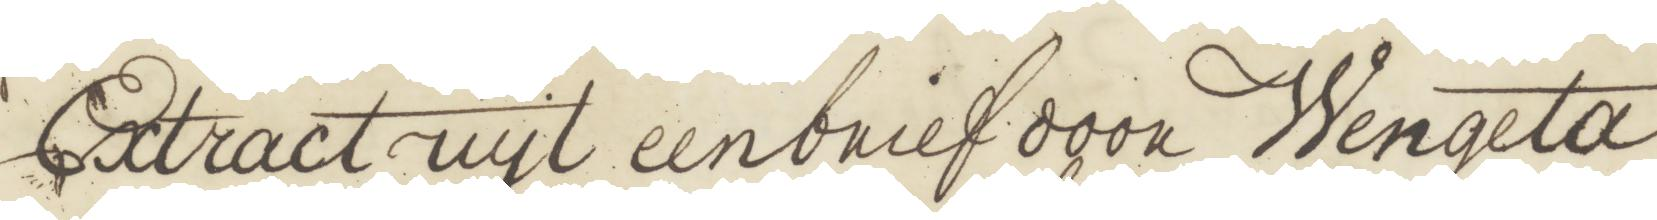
Extract uijt een brief door Wengeta
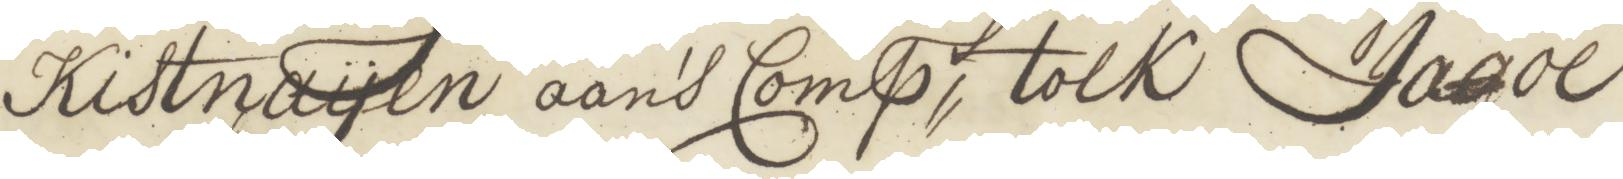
Kistnaijen aan's Comp„s tolk Iagoe
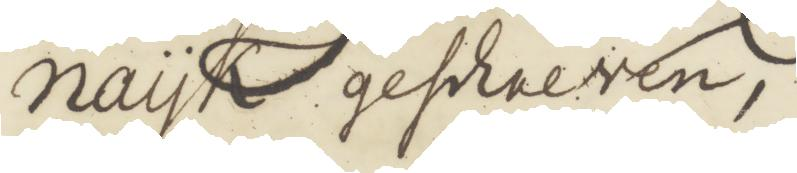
naijk geschreven,
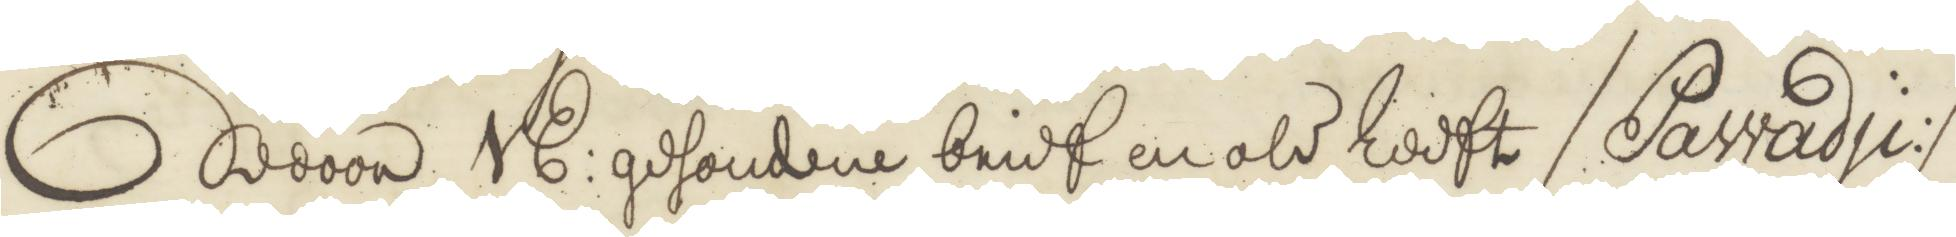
de door VE: gesondene brief en ole heeft /:Pawadji:/
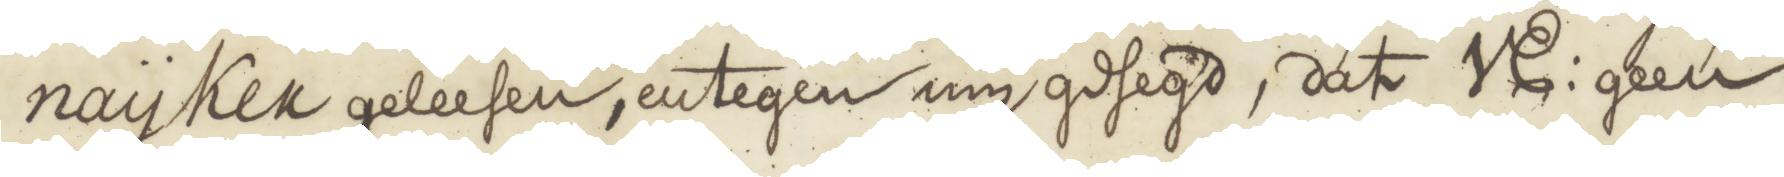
naijker geleesen, en tegen mij gesegd, dat VE: geen
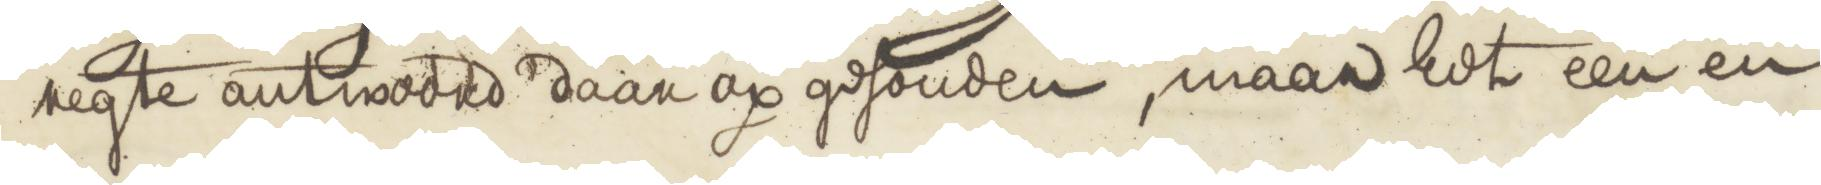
regte antwoord daar op gesonden, maar het een en
